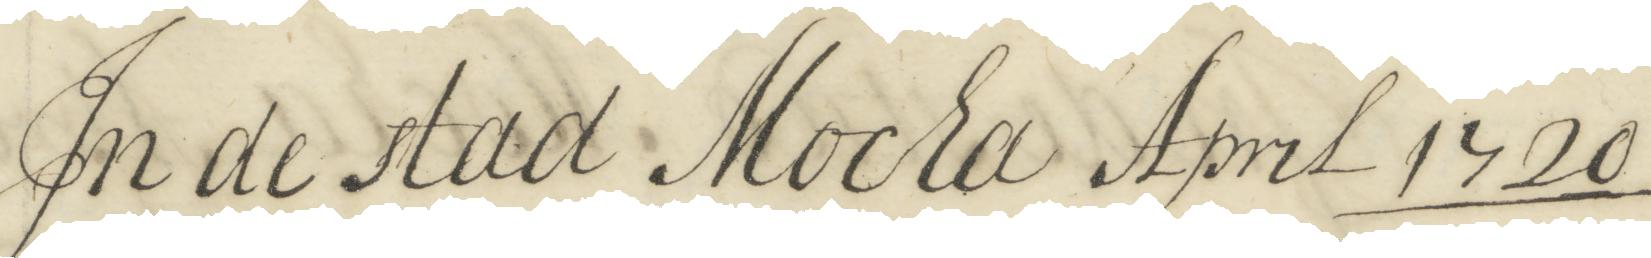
Jn de stad Mocha April 1720
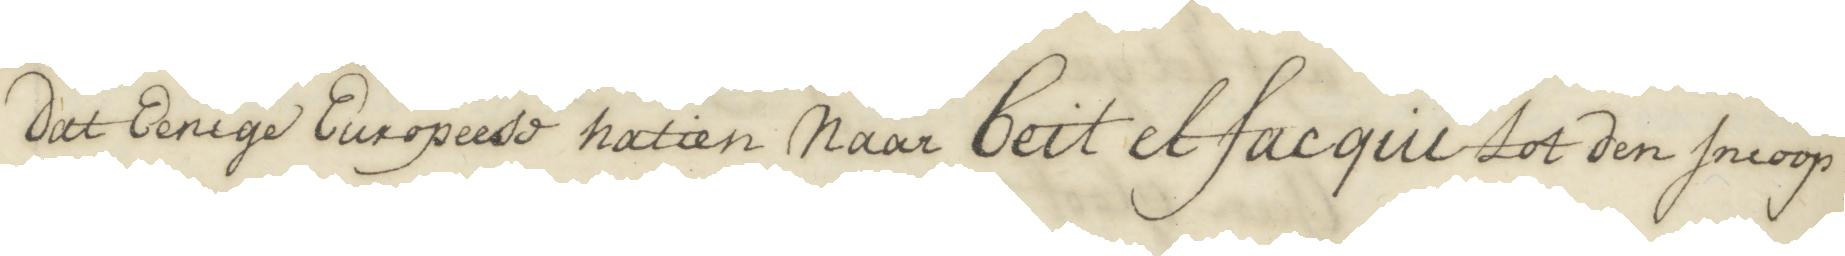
dat Eenige Europeese natien naar beit et facqui tot den jncoop
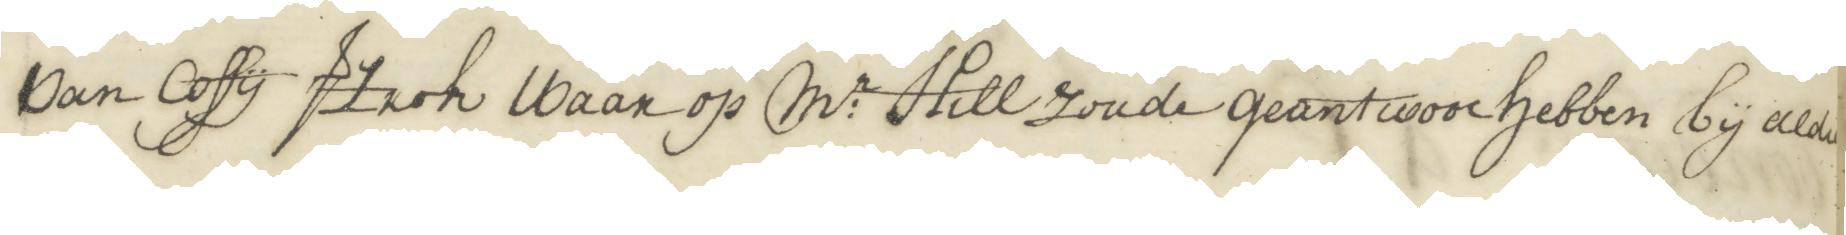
van coffij vertrok waar op m:r Hill zoude geantwoor hebben bij aldu
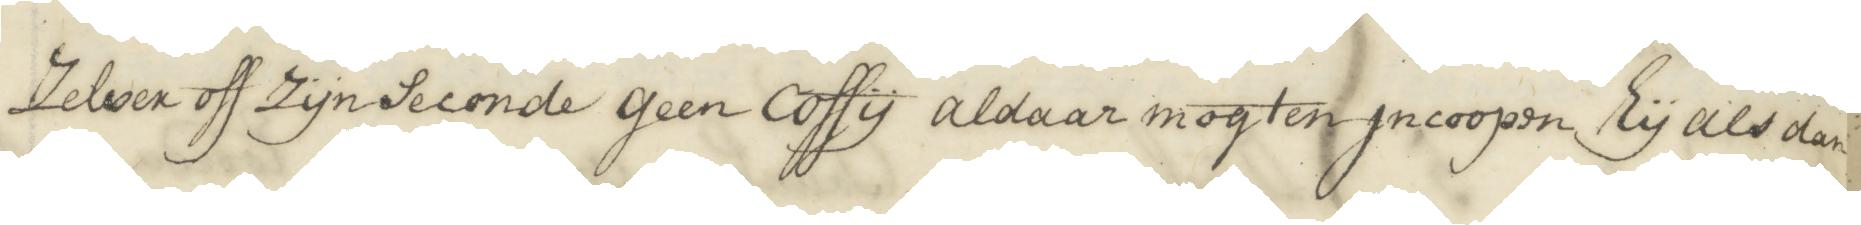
zelver off zijn seconde geen coffij aldaar mogten jncoopen hij als dan
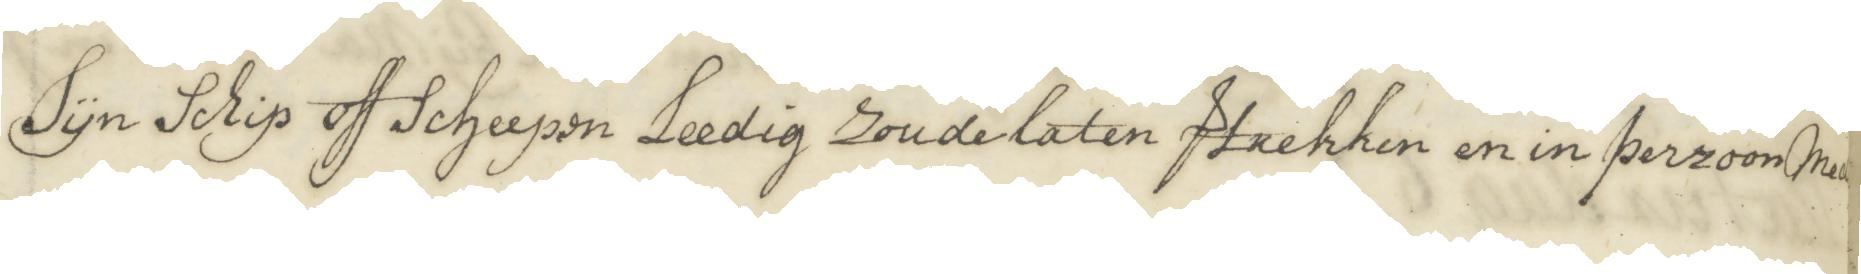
sijn schip off scheepen Leedig zoude laten vertrekken en in perzoon me
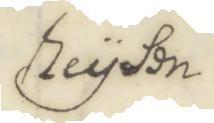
reijsen
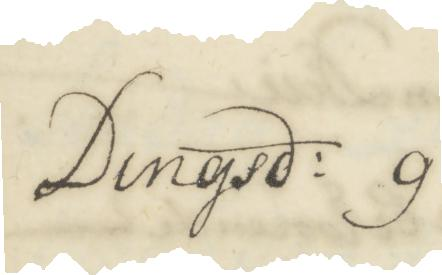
Dingsd: 9
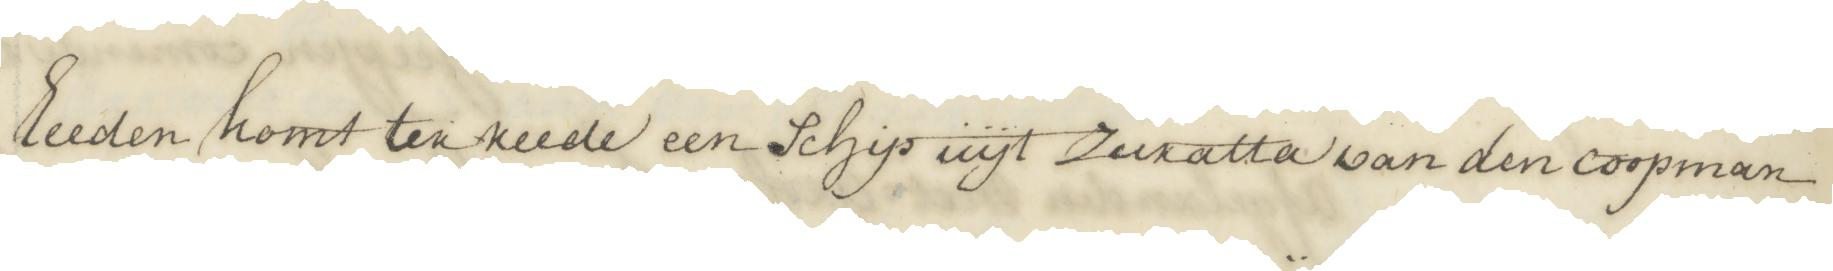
heeden komt ter reede een schip uijt zuratta van den coopman
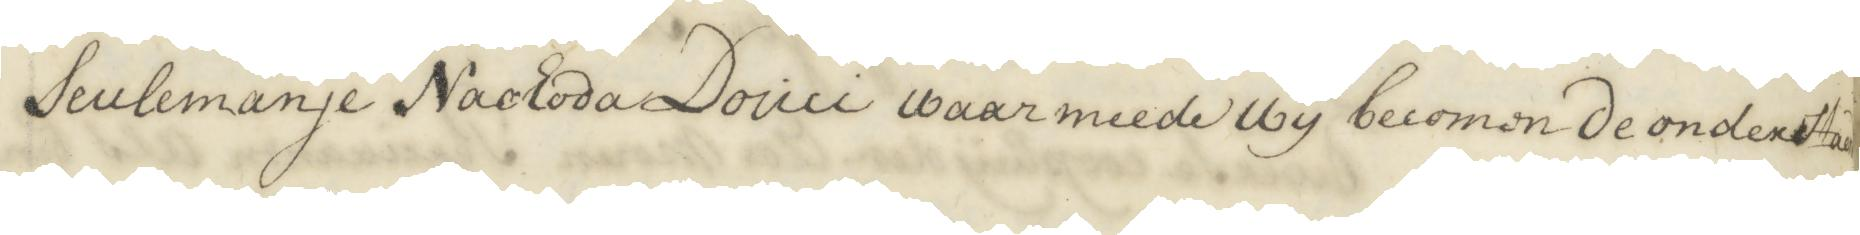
seulemanje Nachoda Doicci waarmeede wij becomen de ondersta
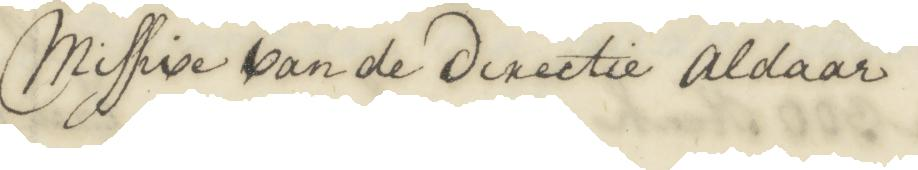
missive van de directie aldaar
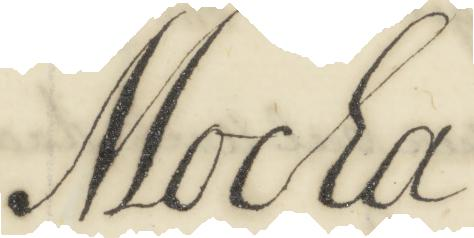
Mocha
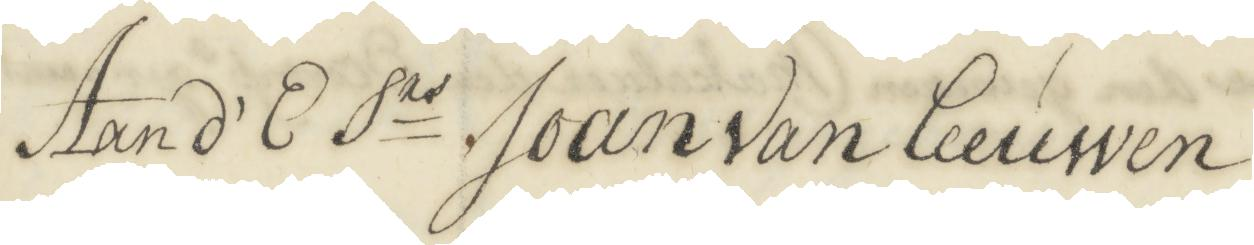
Aan d’ E S=rs Joan van leeuwen
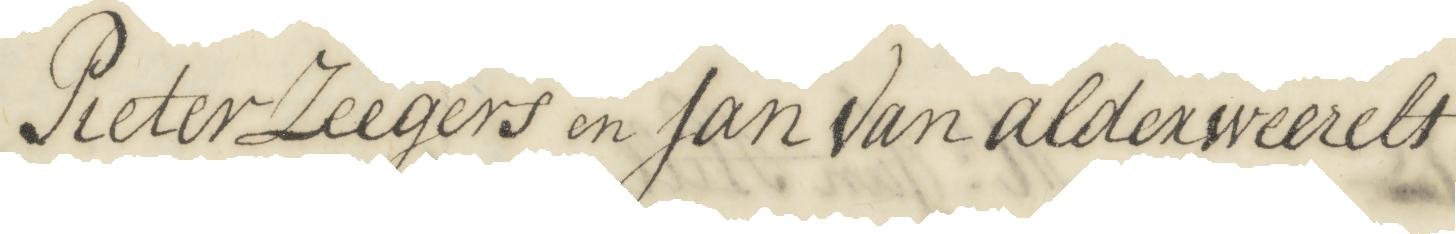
Pieter Zeegers en Jan van alderweerelt
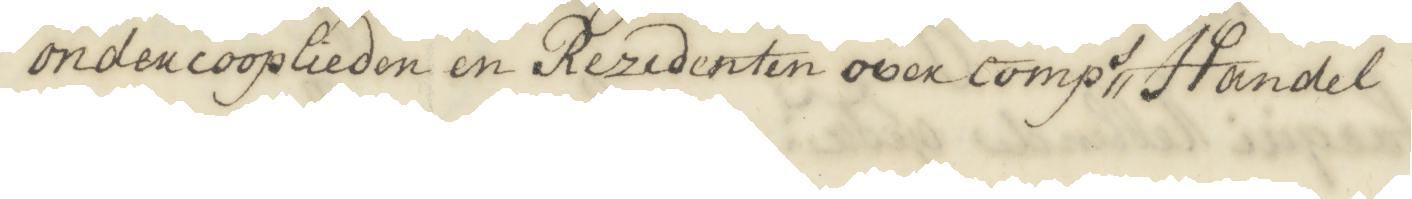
onder cooplieden en Rezidenten over Comp„s Handel
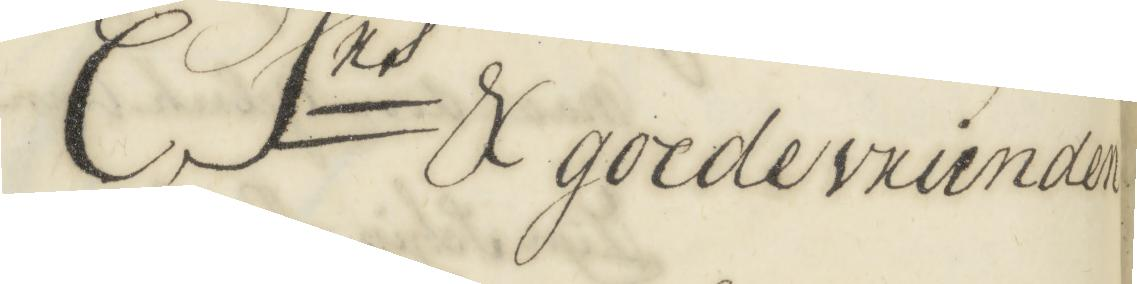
E S=rs & goede vrunden
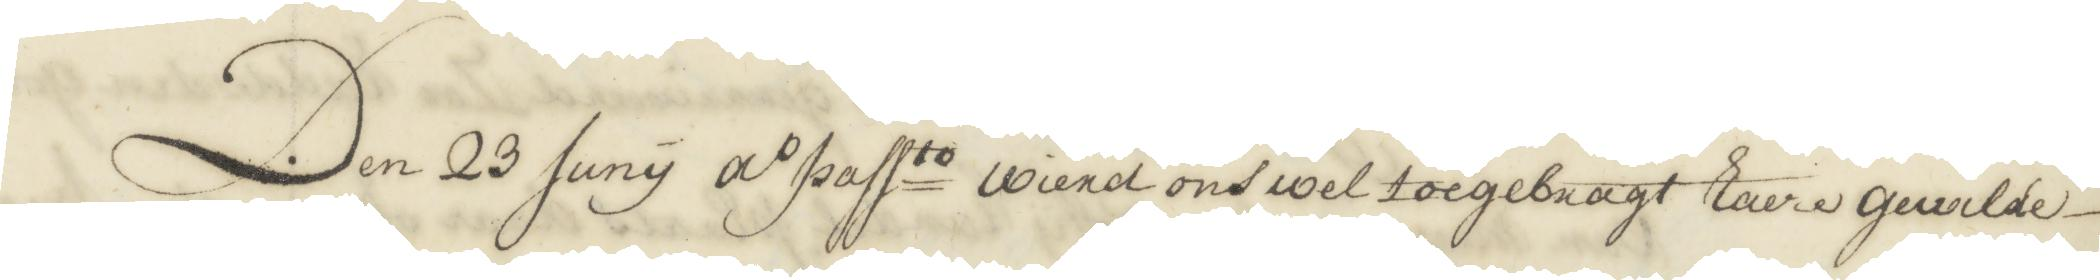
Den 23 Junij ao pass=to wierd ons wel toegebragt haere gewilde—
